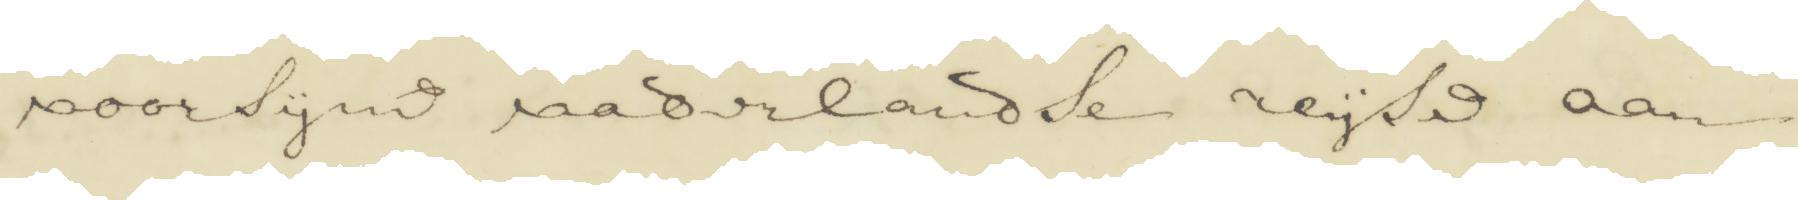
voor sijne vaderlandse reijse aan
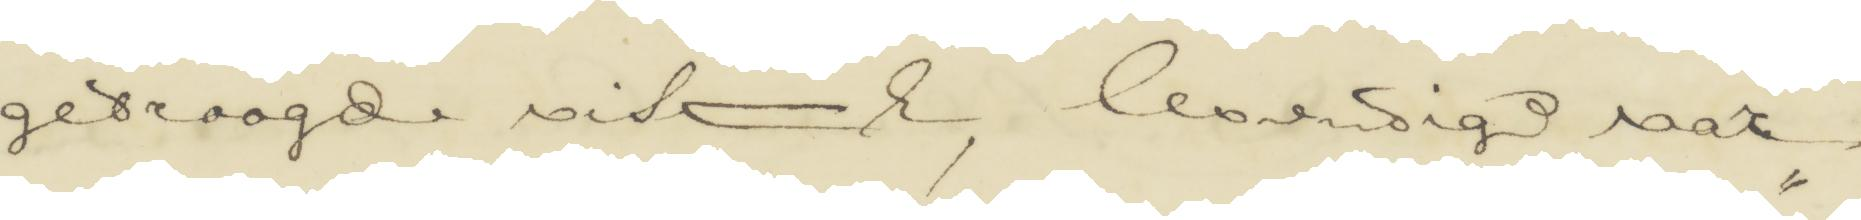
gedroogde visch, levendige var„
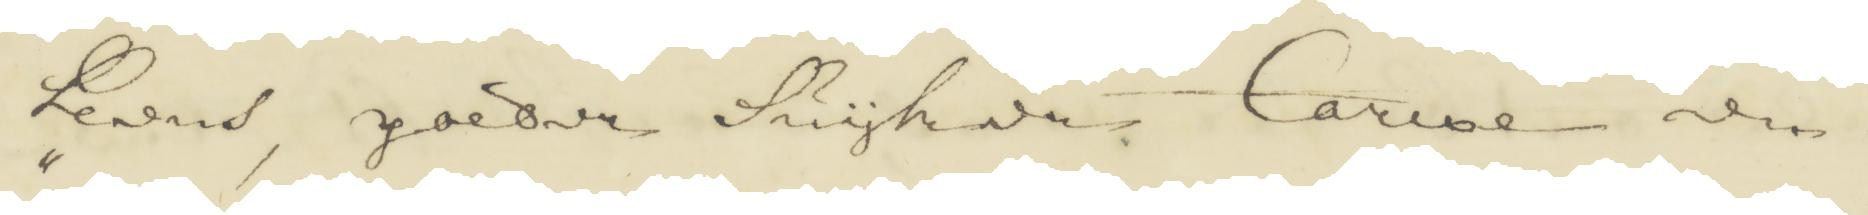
„kens, poeder suijker tarwe en
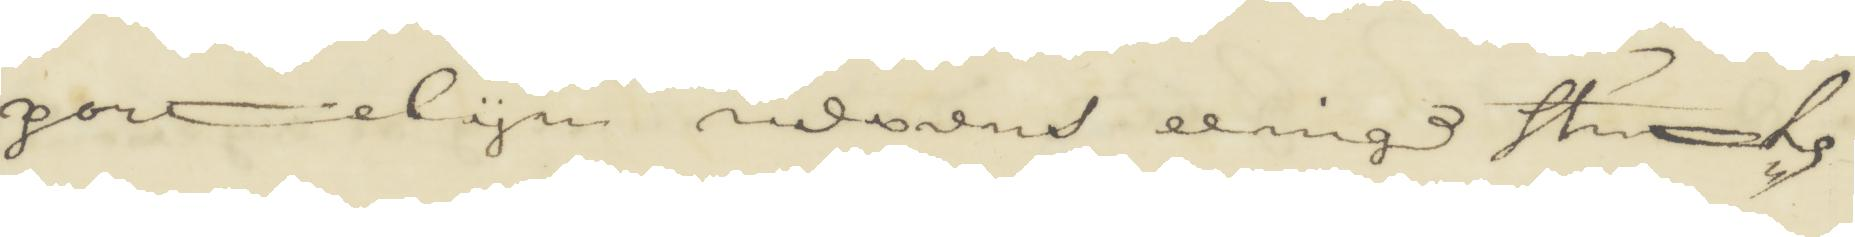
porcelijn nevens eenige stucken„
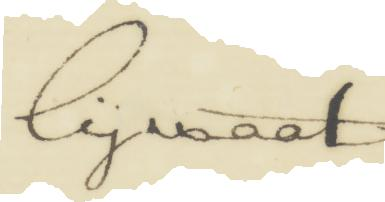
lijwaat.
